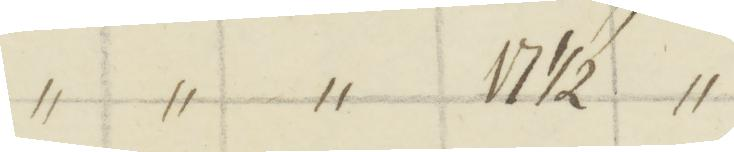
„ „ „ 17½ „
